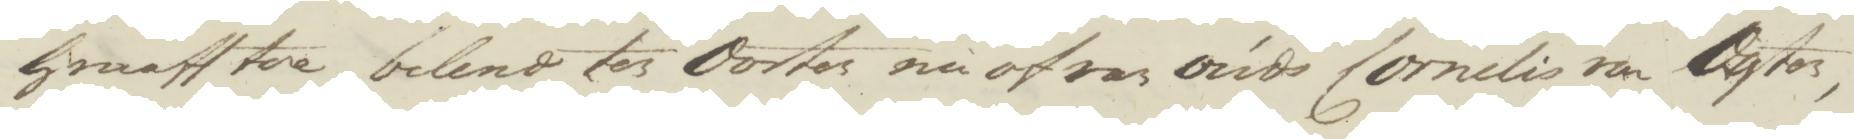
Graaff toe belend ten Oosten nu of van ouds Cornelis van Ogten,
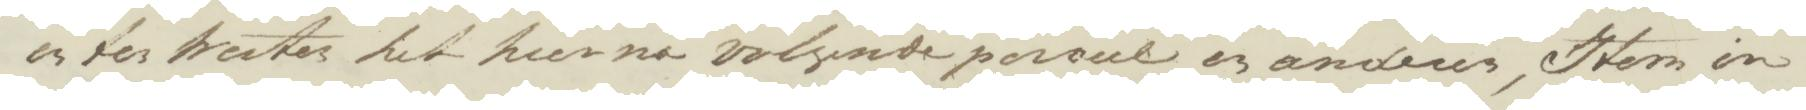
en ten westen het hier na volgende perceel en anderen, Item in
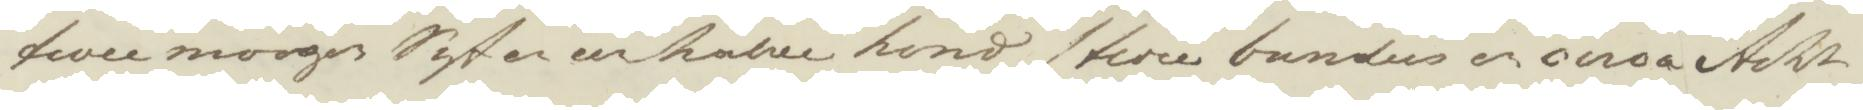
twee morgen Vyfen een halve hond / twee bunders en circa Acht
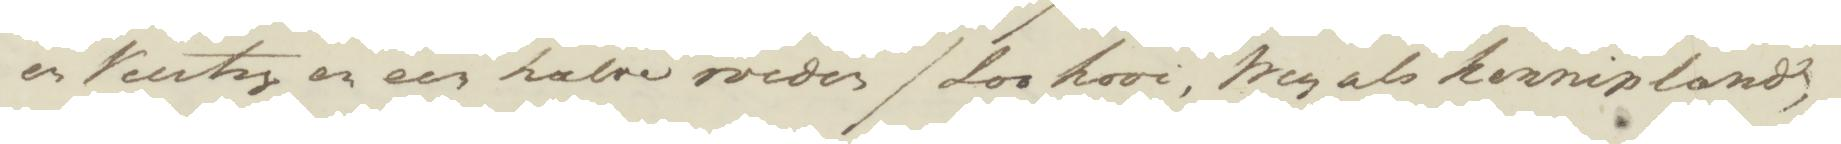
en Veertig en een halve roeden / Zoo hooi, Wey als hennipland,
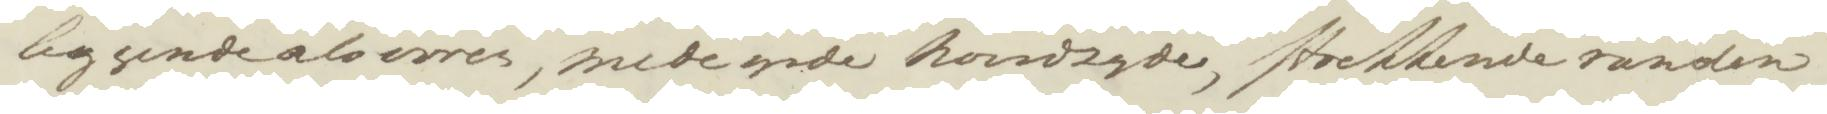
liggende als voren, mede op de noordzyde strekkende van den
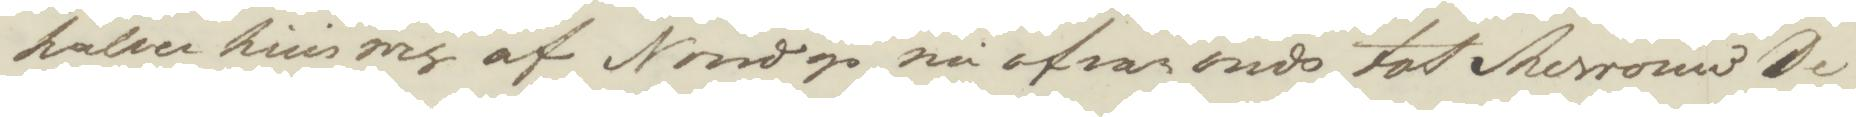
halven huisweg af Noord op nu of van ouds tot Mevrouw de
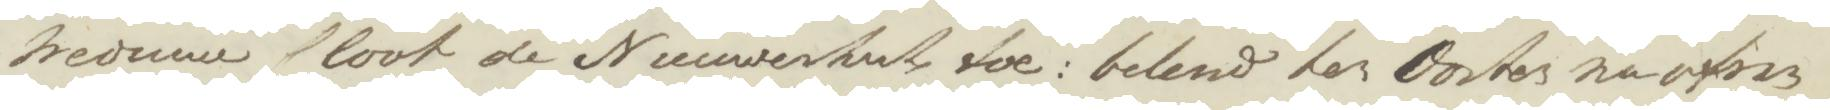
weduwe Cloot de Nieuwerkerk toe: belend ten Oosten nu of van
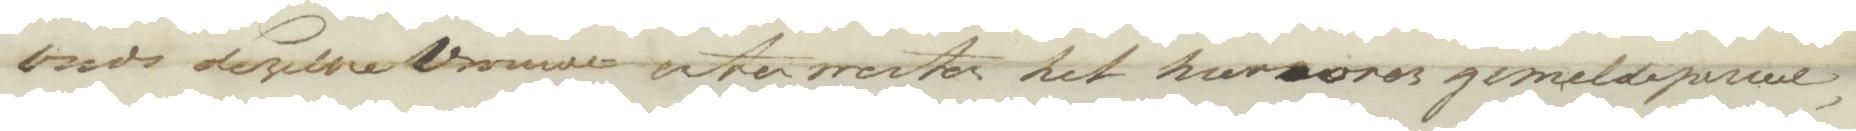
ouds dezelve Vrouwe en ten westen het hiervoren gemelde perceel
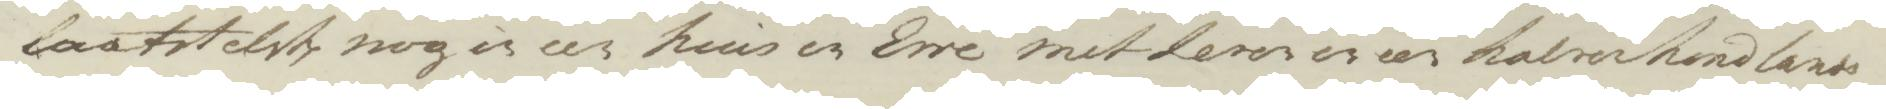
laatstelyk nog in een huis en Erve met Zeven en een halven hond lands
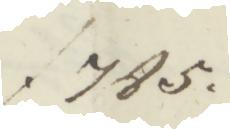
f 785.
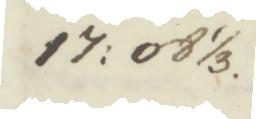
17: 08 1/3.
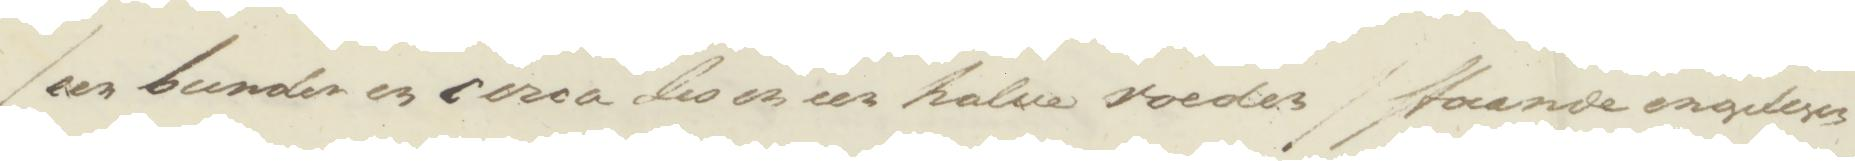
/ een bunder en circa Zes en een halve roeden / staande en gelegen
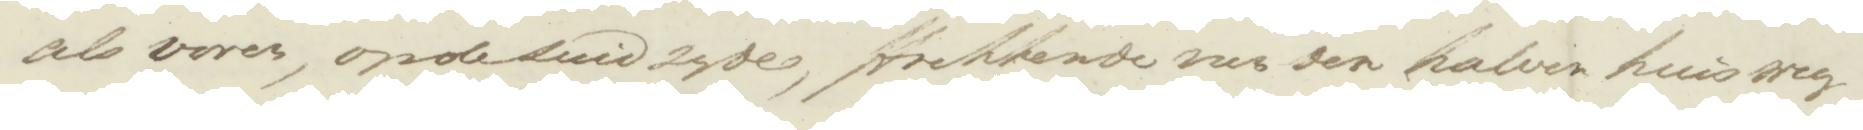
als voren, op de zuidzyde, strekkende van den halven huis weg
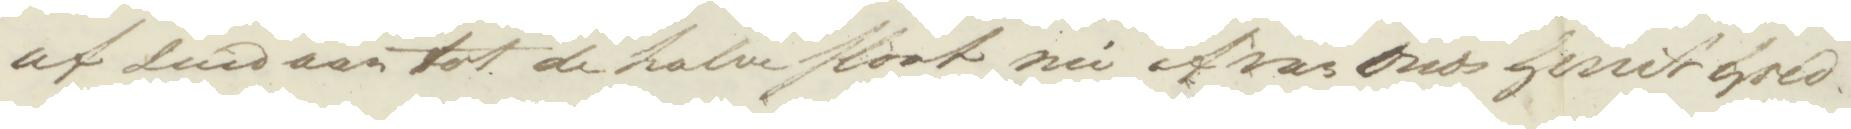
af zuid aan tot de halve sloot nu of van ouds Gerrit Goed
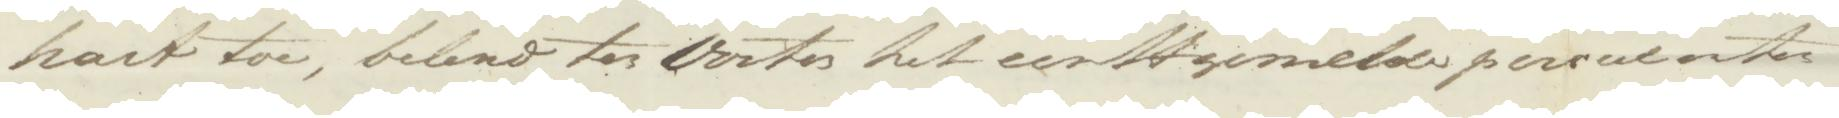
hart toe, belend ten Oosten het eerstgemelde perceel en ten
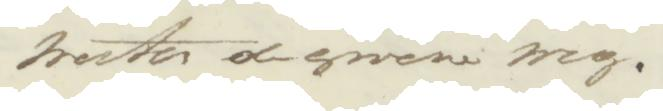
westen de groene weg.
